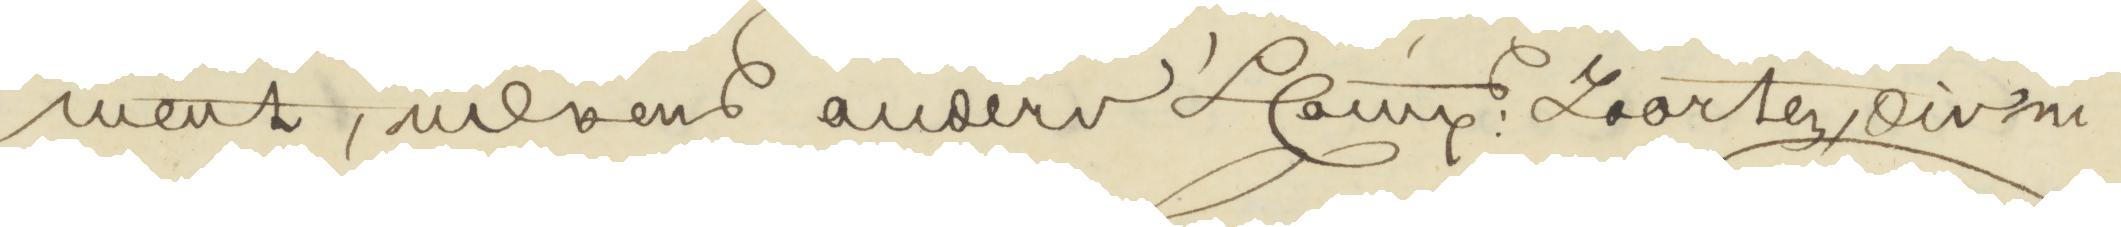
ment, nevens andere ’s Comp:s zoorten, die in
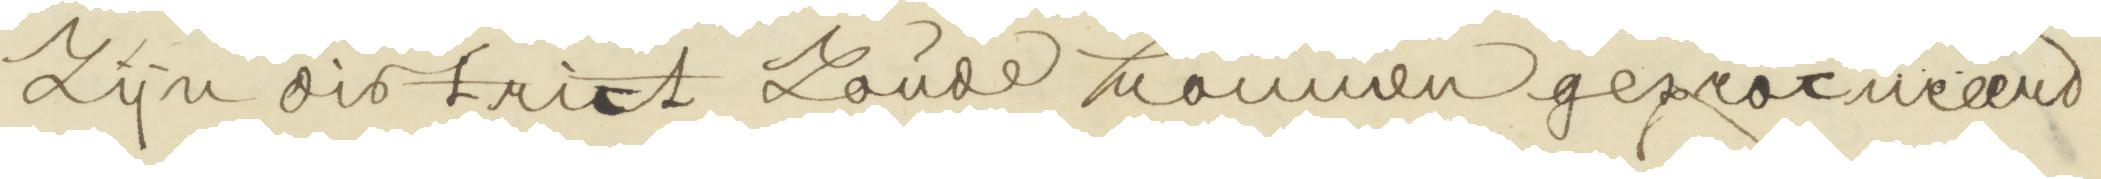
zijn district zoude konnen geprocureerd
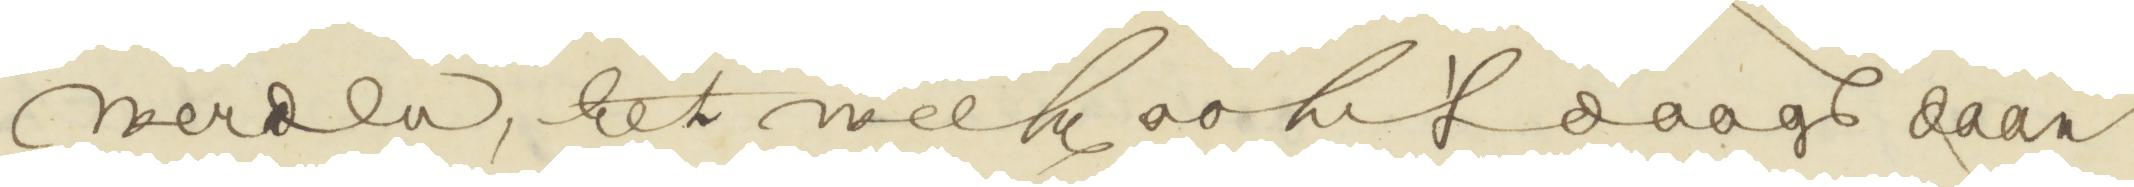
werden, het welk ook 's daags daar
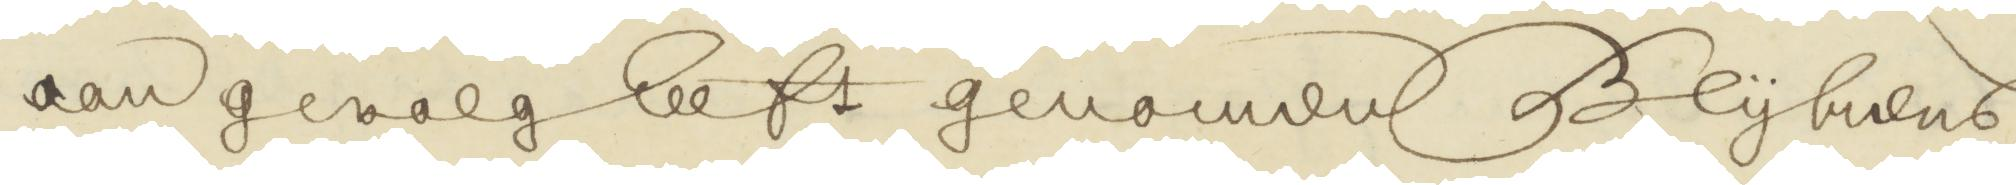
aan gevolg heeft genomen Blijkens
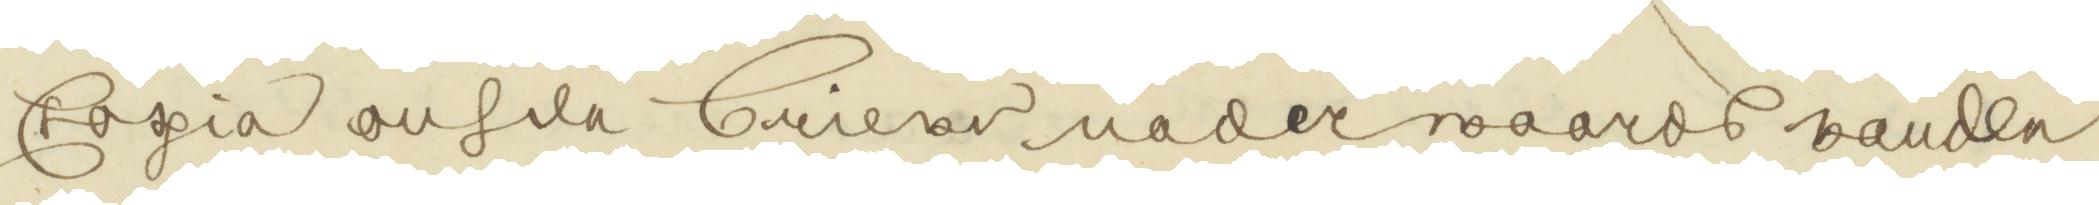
Copia onser brieve naderwaards van den
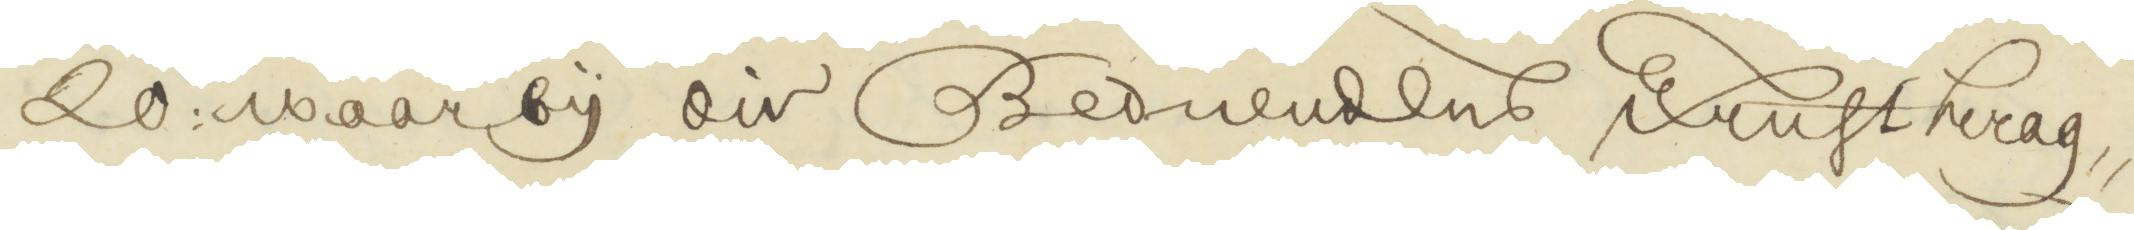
20:' waar bij die Bediendens Ernst krag„
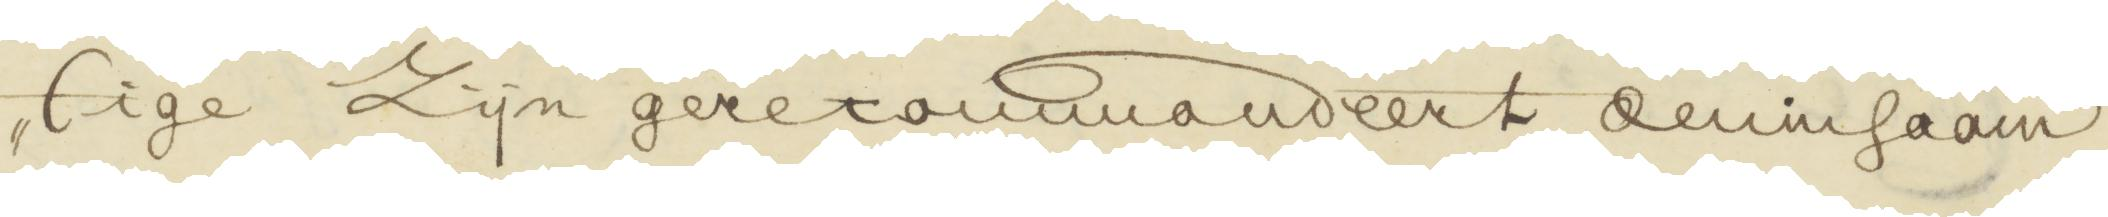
„tige zijn gerecommandeert den insaam
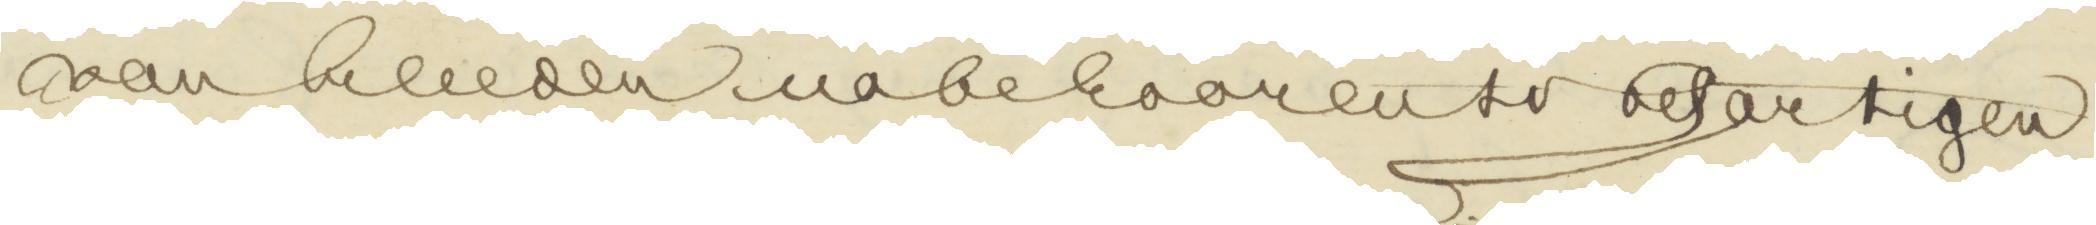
van kleeden na behooren te behartigen
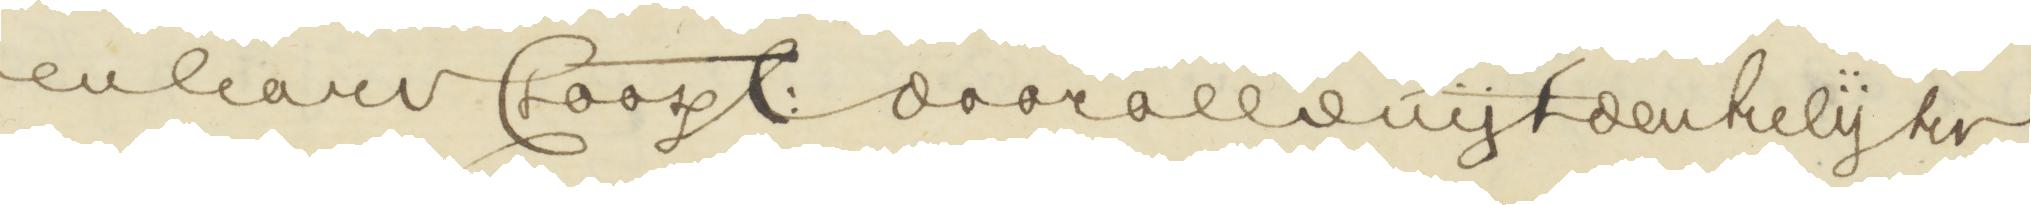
en hare coopl: door alle uijtdenkelijke
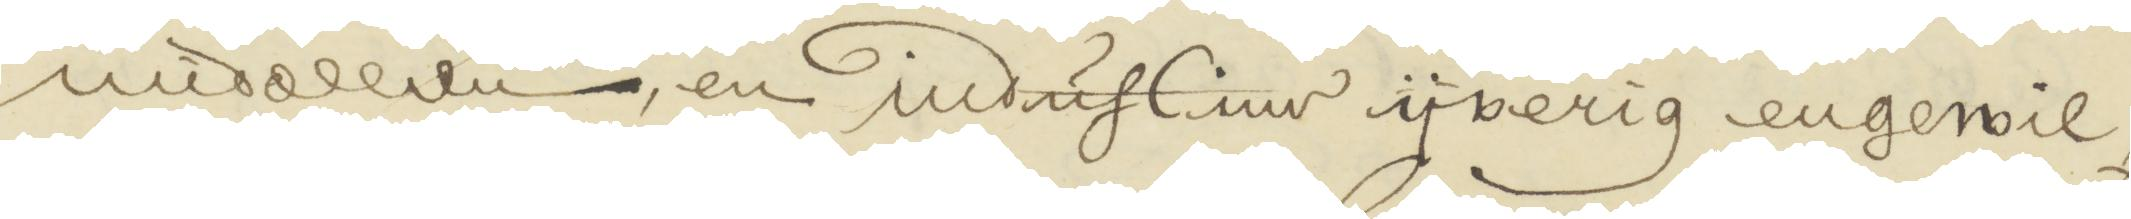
middelen, en industine ijverig en gewil„
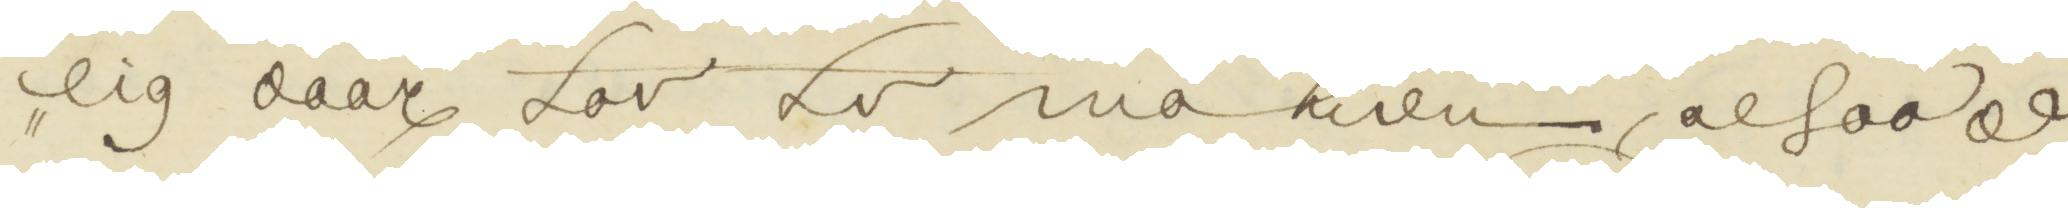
„lig daar toe te maken, alsoo de
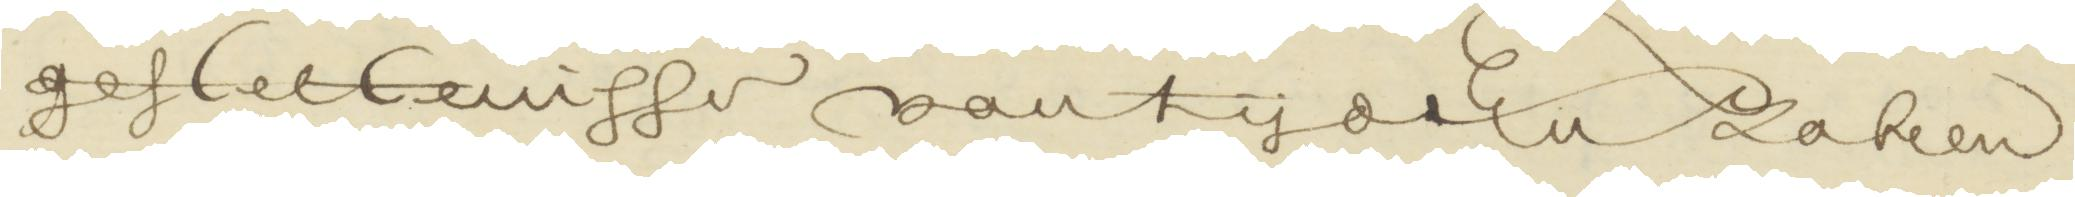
gesteltenisse van tijd ten zaken
